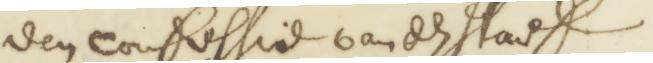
een confessie van den slaef
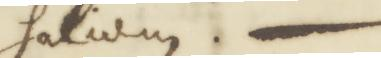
saliem. —
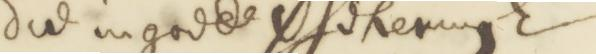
die ingoede versekeringh
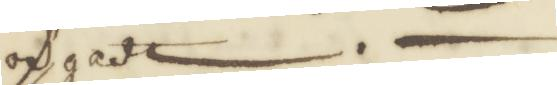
overgaet. —
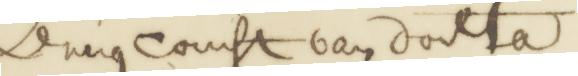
terug comst van doeta
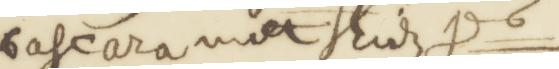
bescara met thien p=s
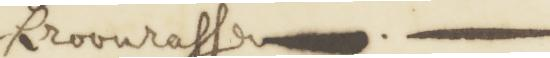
kroonrassen. —
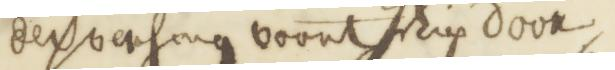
de verversing voor't schip door„
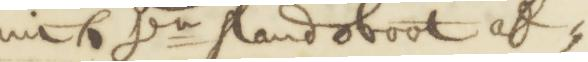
nick p=r slandsboot af„
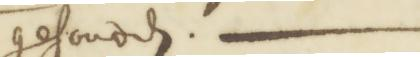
gesonden. —
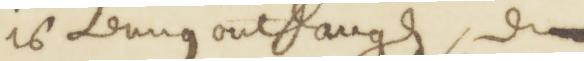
is terug ontfangen, en
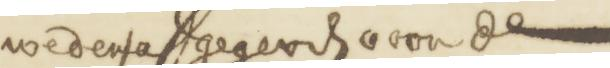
weder afgegeven voor de
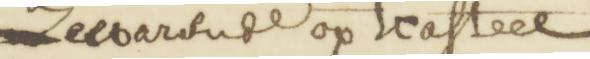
zeevarende op 't casteel
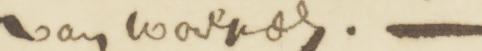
van woerden. —
